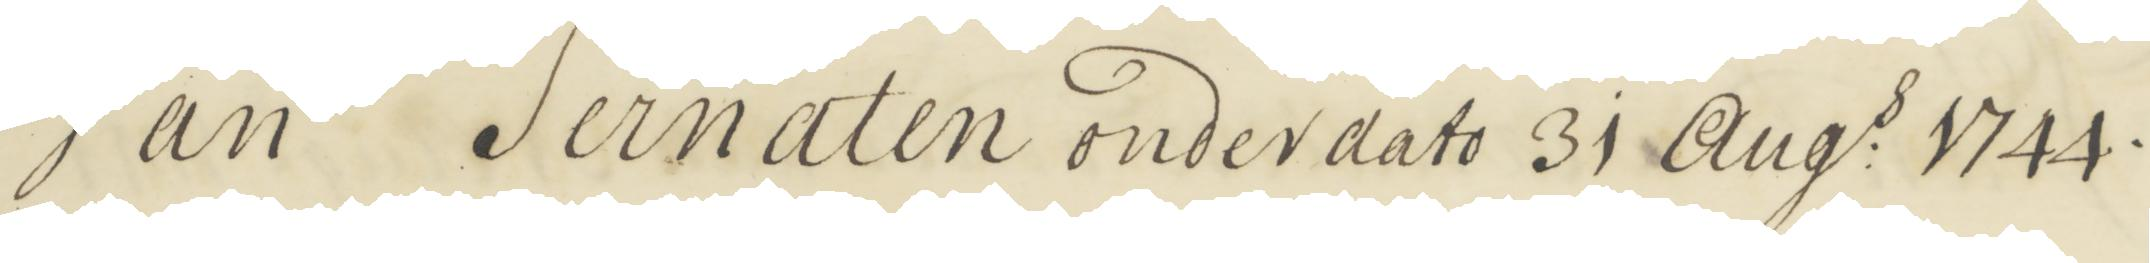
Van Ternaten onder dato 31 Aug:s 1744.
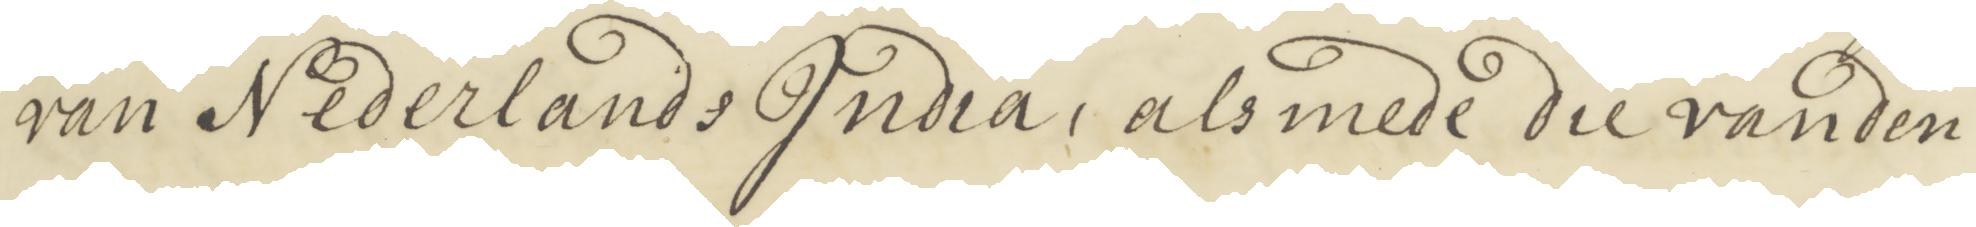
van Nederlands Jndia, als mede die van den
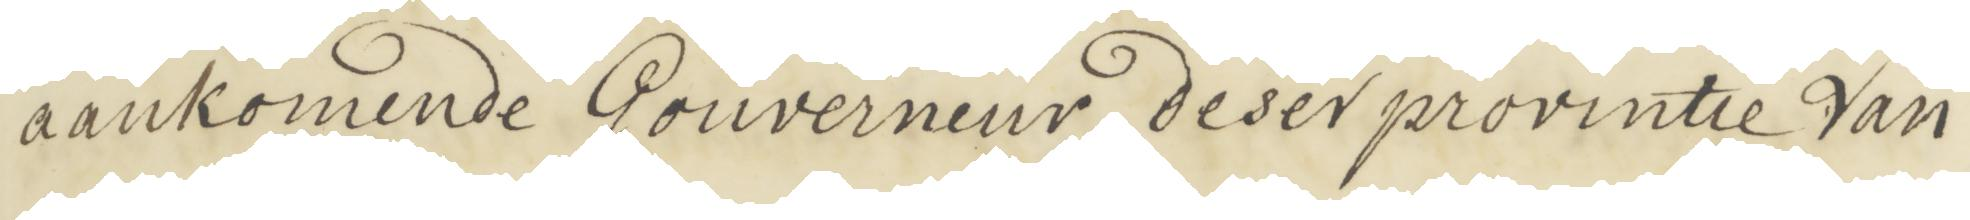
aankomende Gouverneur deser provintie van
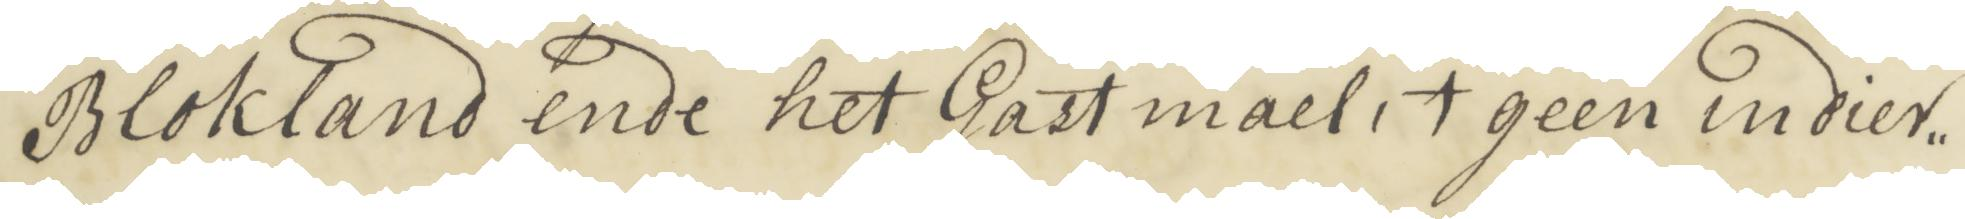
Blokland ende het Gastmael, t geen in dier„
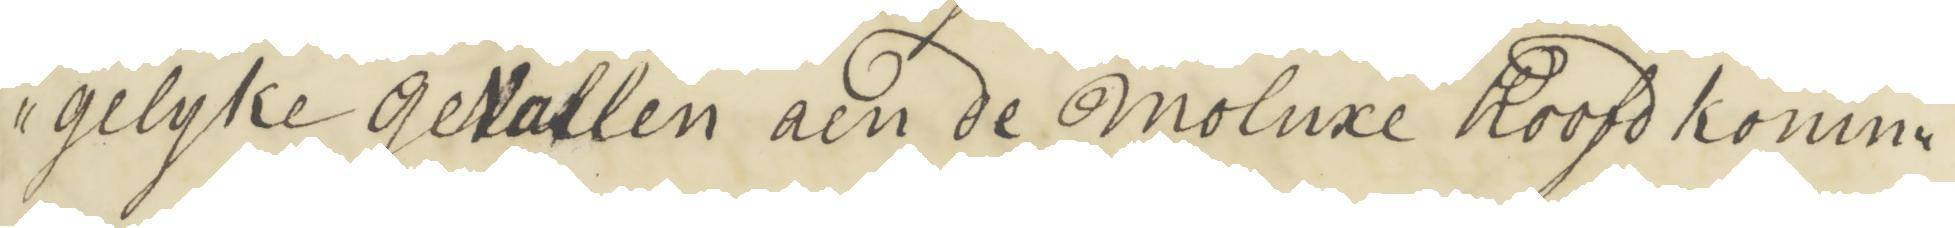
„gelyke gevallen aen de moluxe hoofd konin„
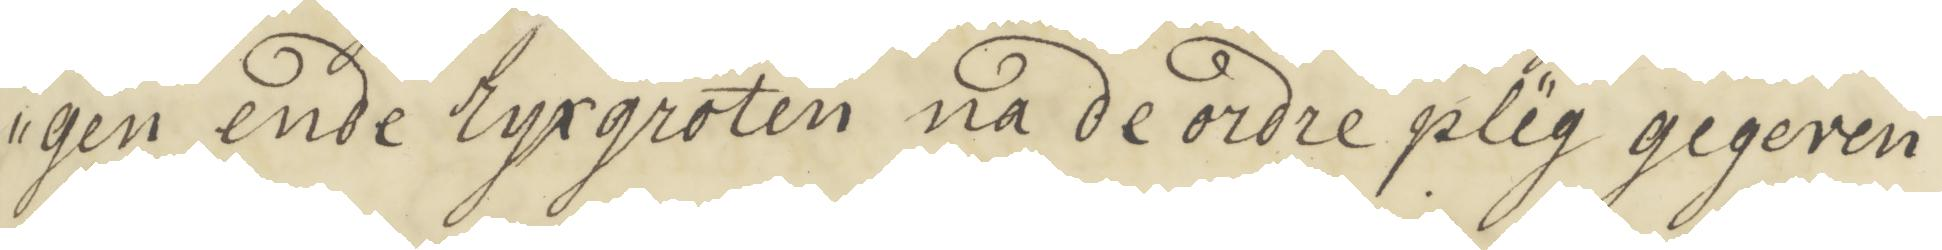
„gen ende ryxgroten na de ordre plëg gegeven
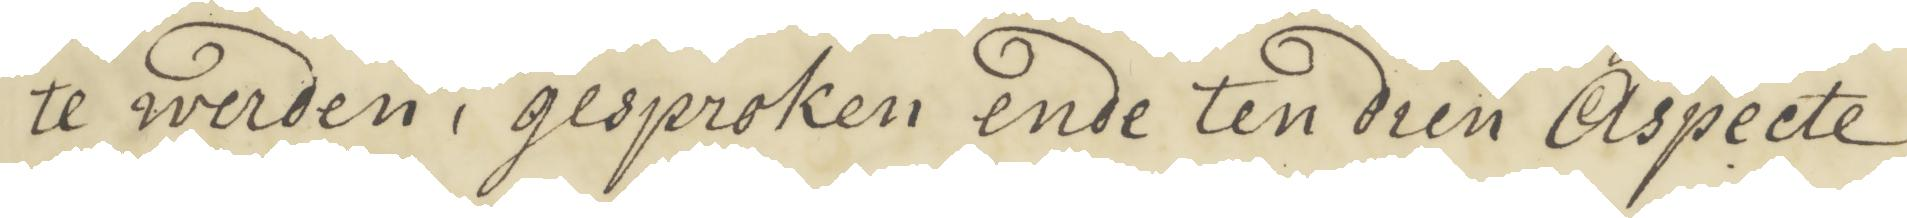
te werden, gesproken ende ten dien Aspecte
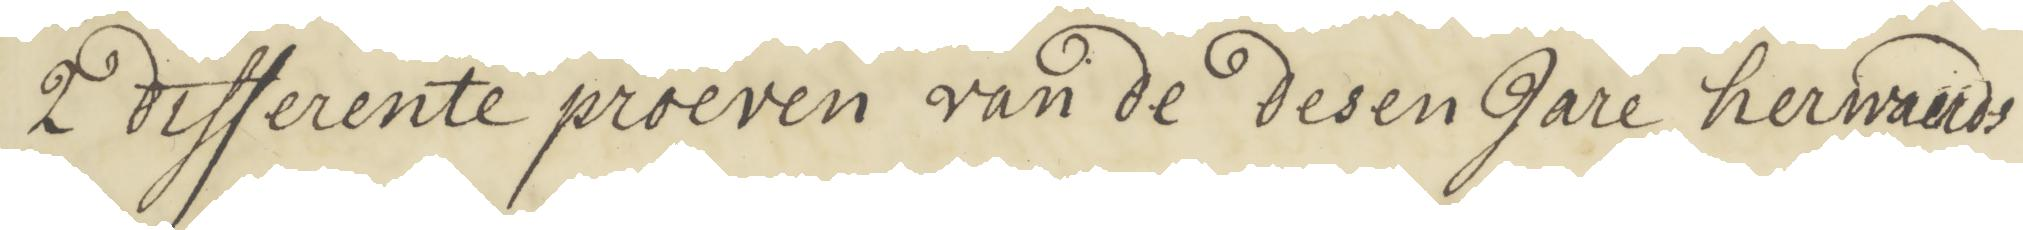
2 differente proeven van de desen Jare herwaerds
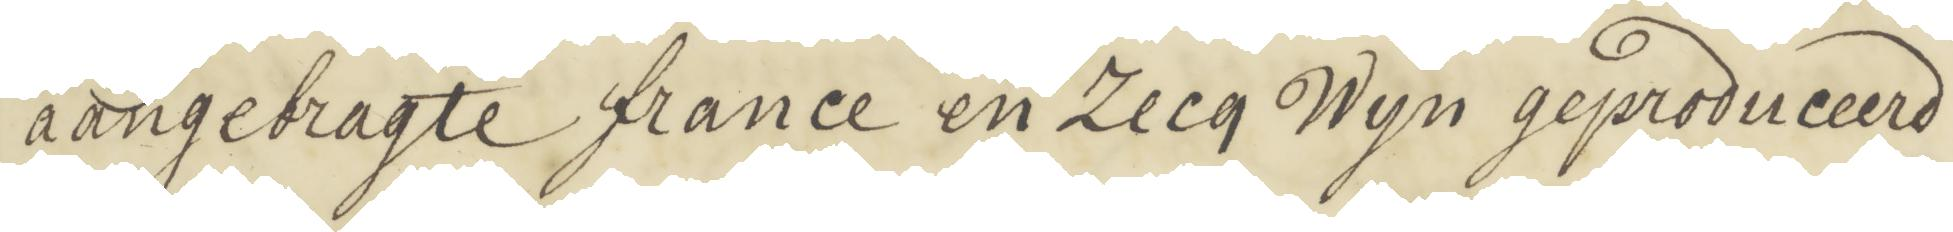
aangebragte france en zecq wyn geproduceerd
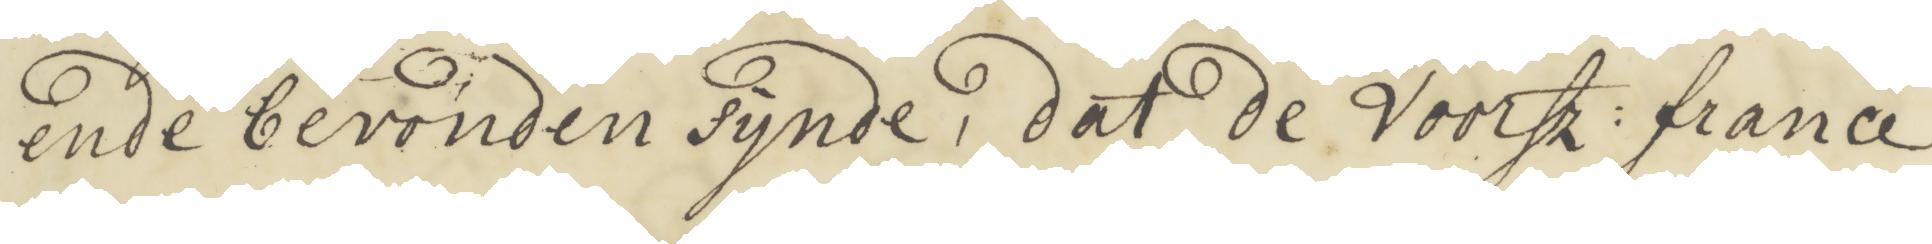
ende bevonden sijnde, dat de voorsz: france
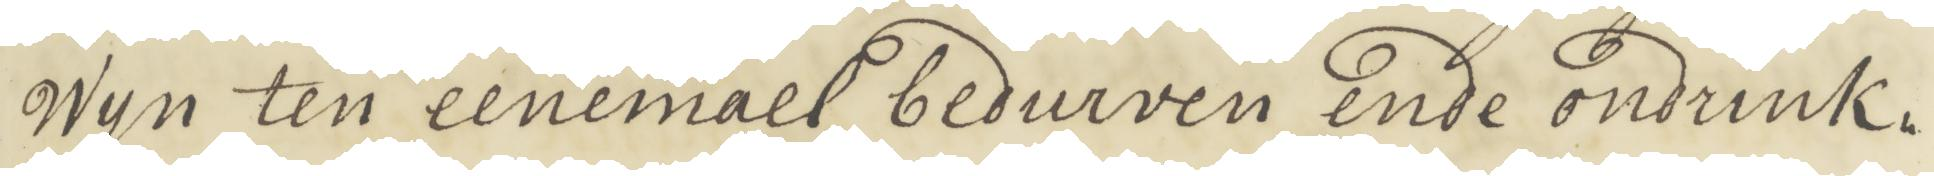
wyn ten eenemael bedurven ende ondrink„
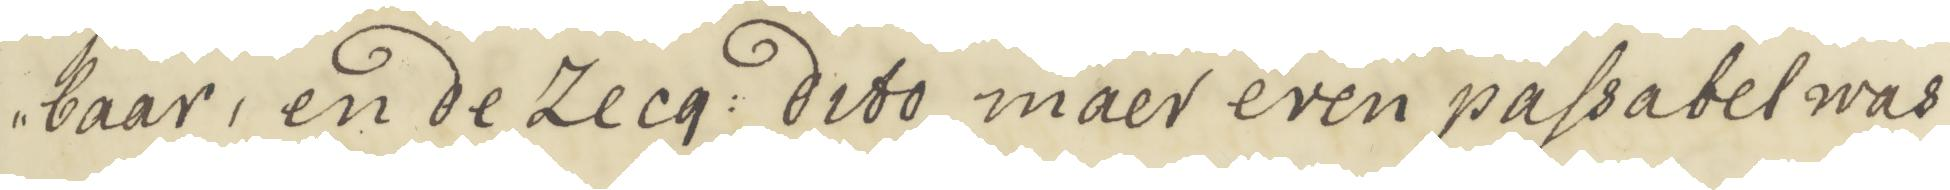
„baar, en de zecq: dito maer even passabel was
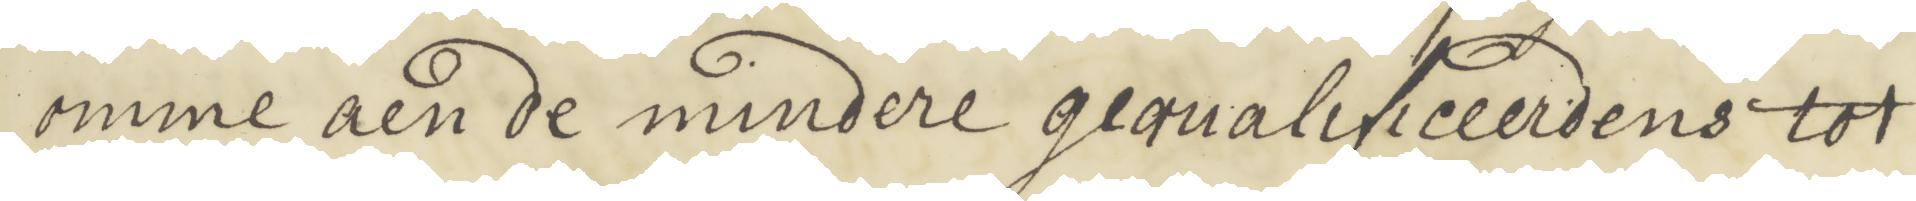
omme aen de mindere gequalificeerdens tot
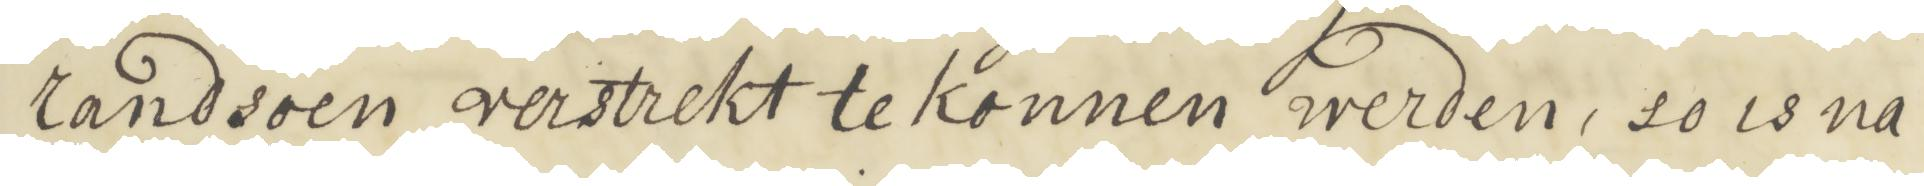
randsoen verstrekt te konnen werden, so is na
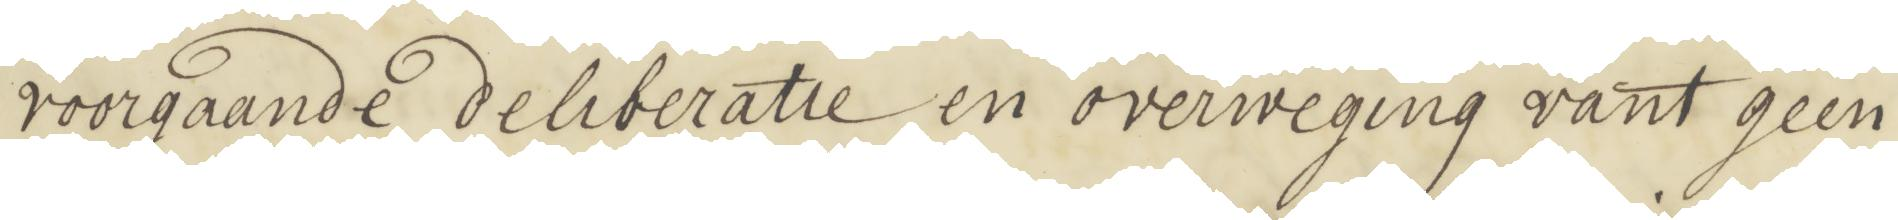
voorgaande deliberatie en overweging vant geen
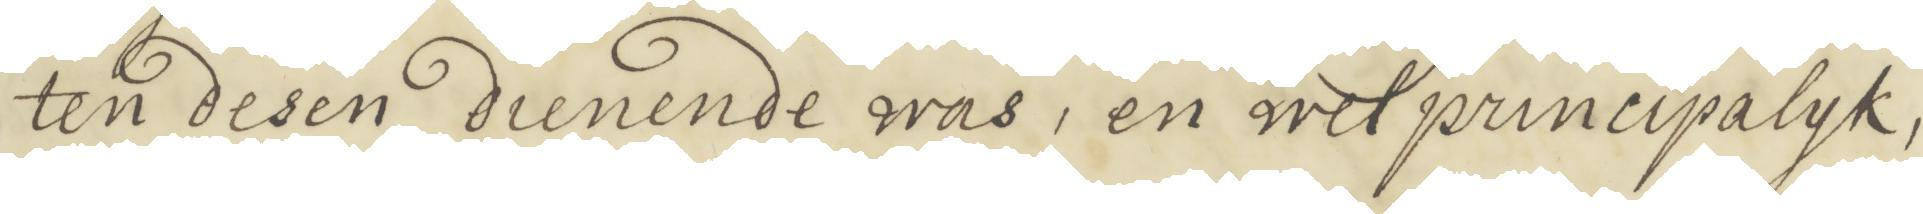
ten desen dienende was, en wel principalyk
